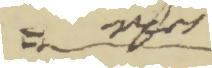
= vers
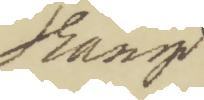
Transpo
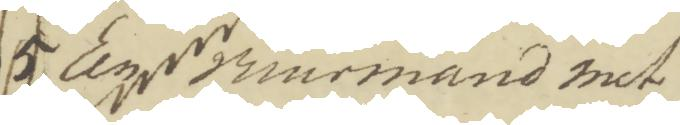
Een vuurmand met
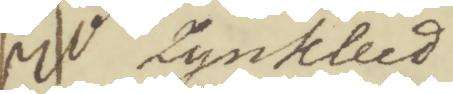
zyn kleed
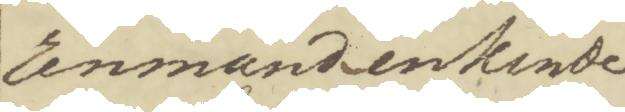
Een mand en kinde
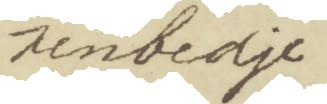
renbedje
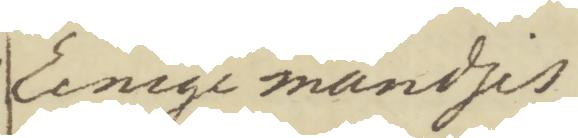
Eenige mandjes
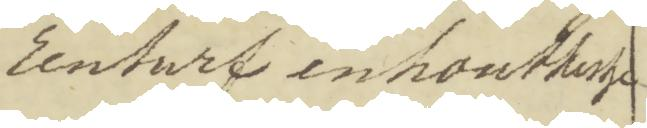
Een turf en houtkistje
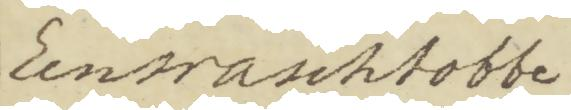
Een waschtobbe
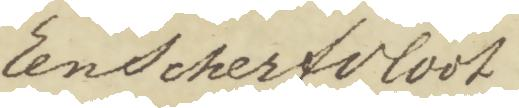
Een scherfvloot
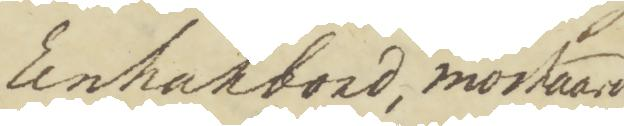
Een hakbord, mostaard
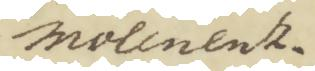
molen enz.
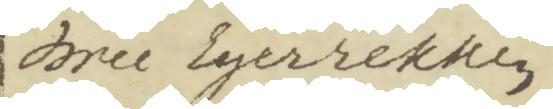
Twee Eyerrekken
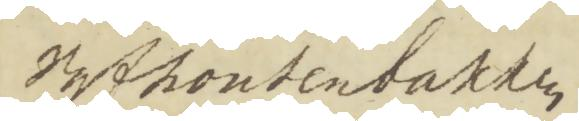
Vyf houten bakken
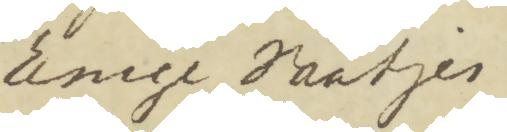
Eenige Vaatjes
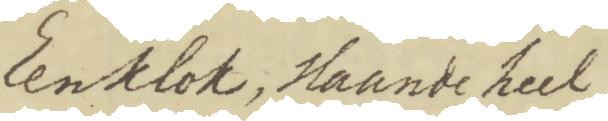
Een klok, staande heel
